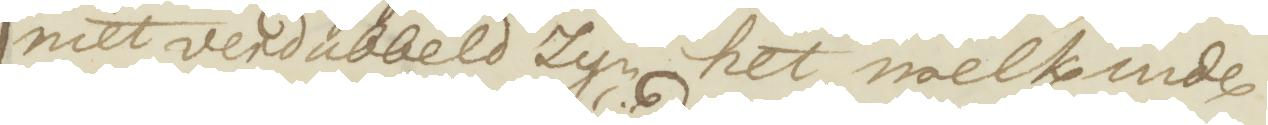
niet verdubbeld zijn het welk inde
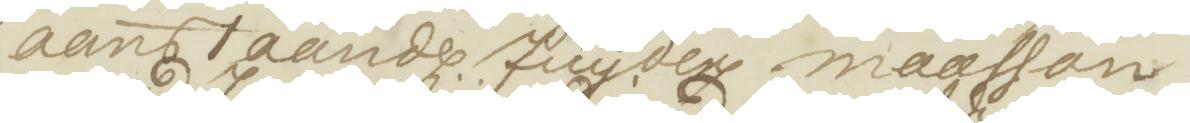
aanstaande Zuijder maasson
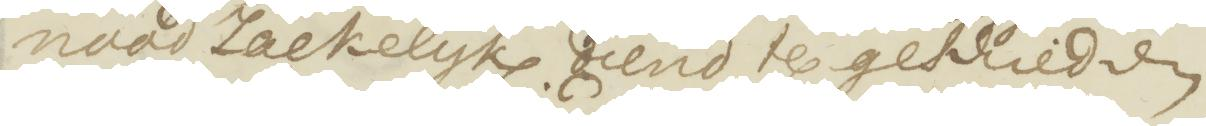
nood zaekelijk diend te geschieden
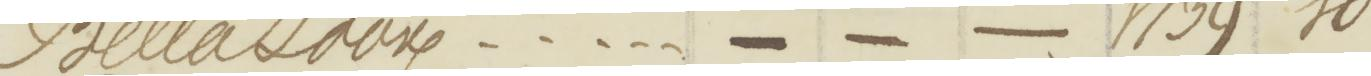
Bellazoor - - - - - — — — 1739 10
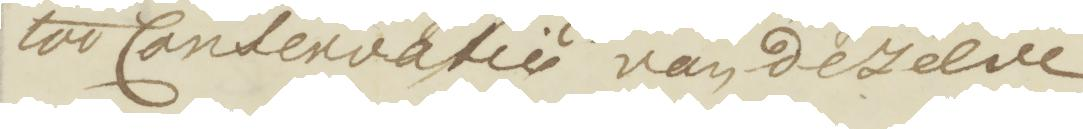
tot conservatie van dezelve
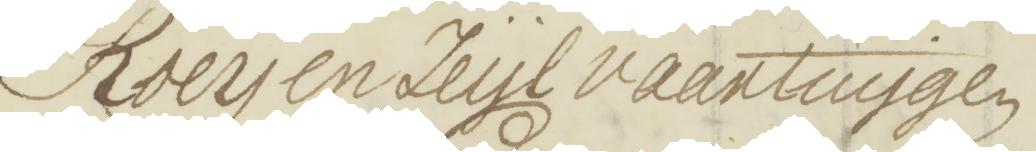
Roeij en zeijl vaartuijgen
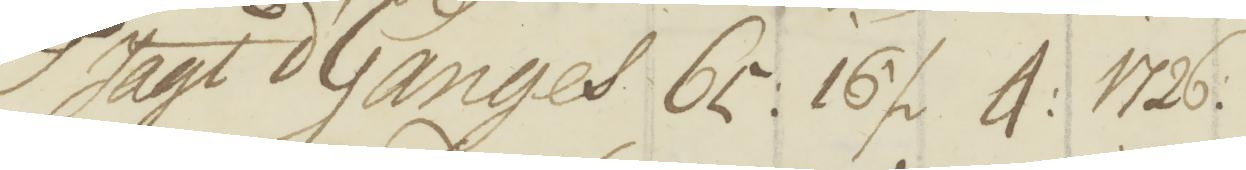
'T Jagt d'Ganges 65: 16½ 4: 1726:
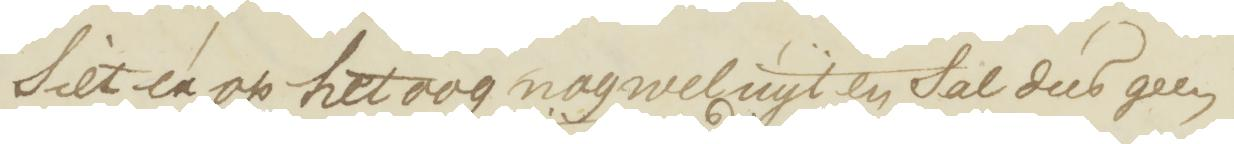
siet er op het oog nog wel uijt en sal dies geen
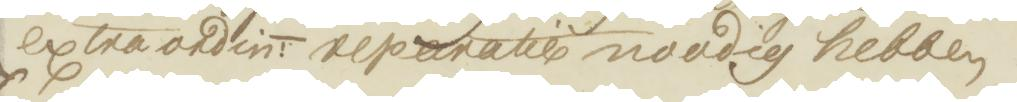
extraordin: reparatie noodig hebben
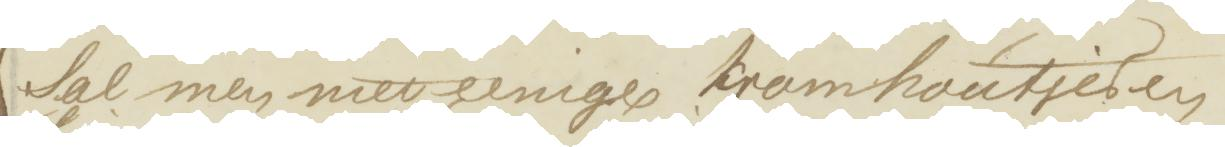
sal men met eenige kromhoutjes en
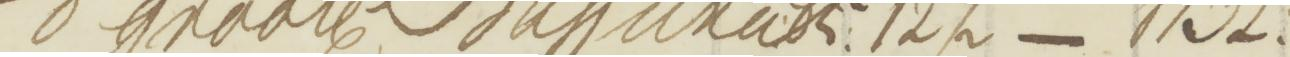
d’ groote Bassura 85: 12½ — 1732.
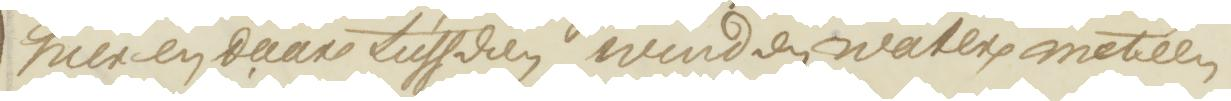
hier en daar tusschen wind en water met een
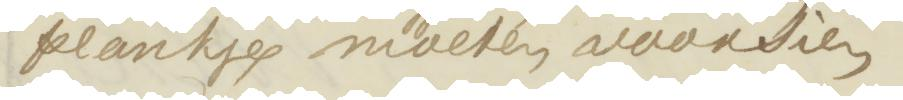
plankje moeten voorsien
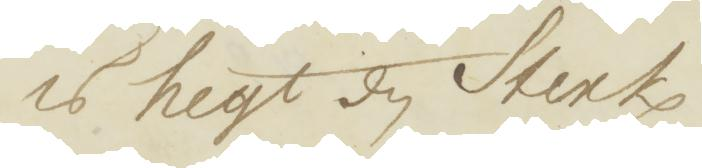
is hegt en sterk
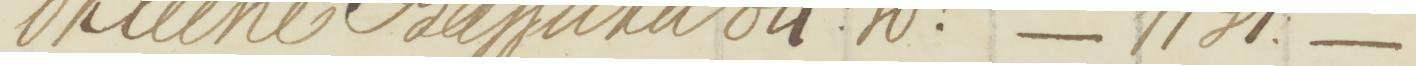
d'kleene Bassura 84 :10: — 1737:
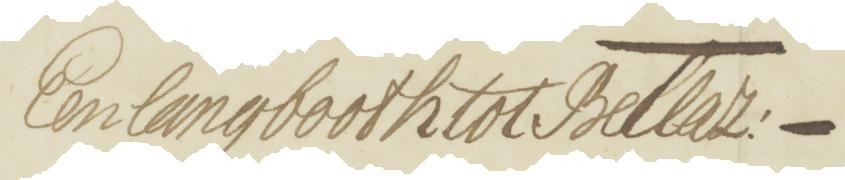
Een langbooth tot Bellaz: —
